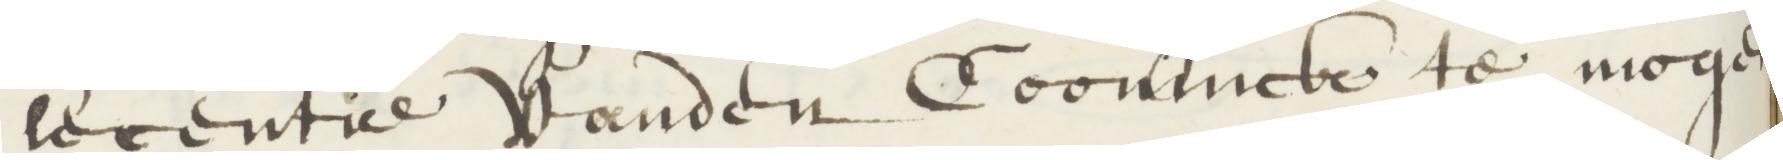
lecentie vanden Cooninck te mogen
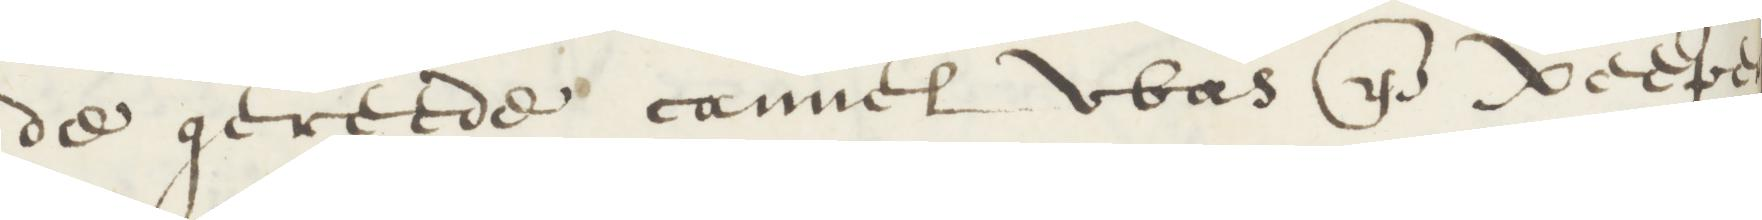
de gereede cannel was ende peepe
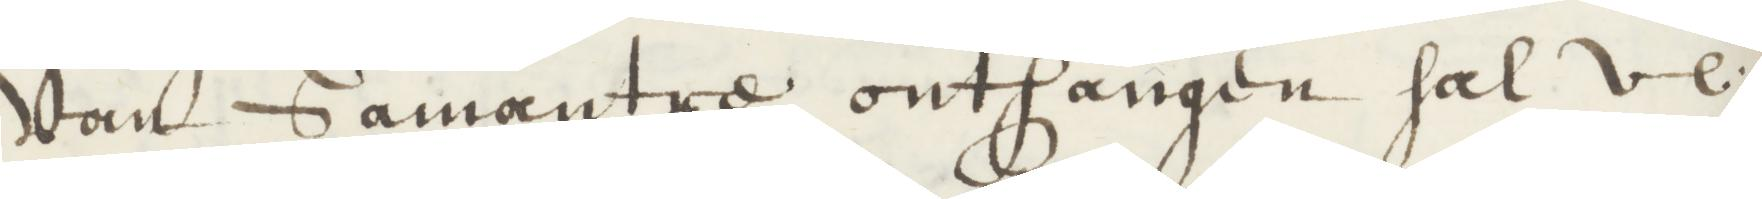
vant Samantre ontfangen sal vl:
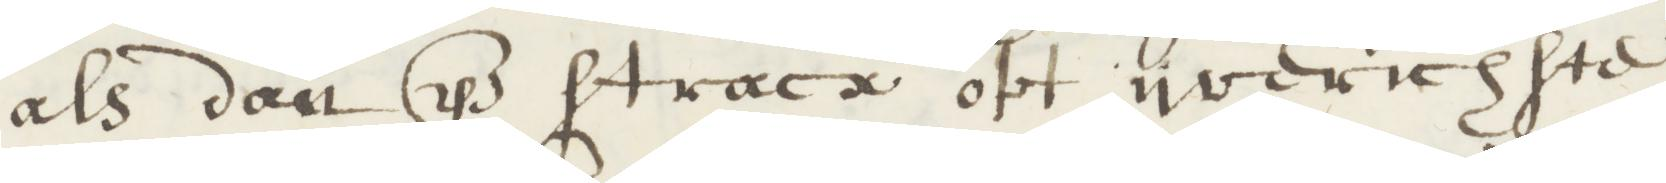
als dan ende stracx opt ijverichste
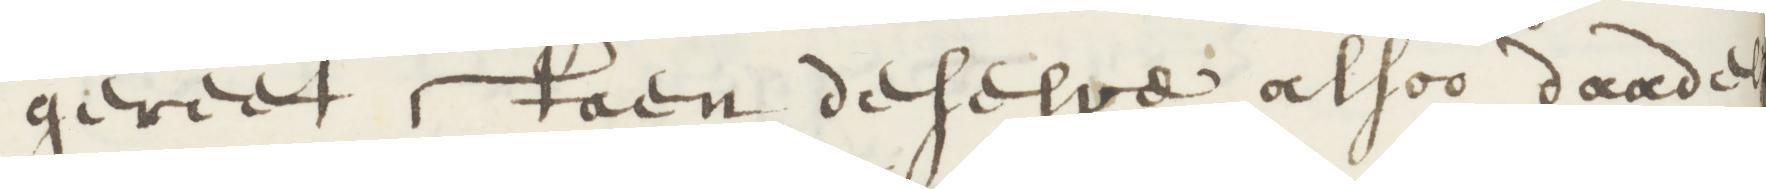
gereet staen deselve alsoo daade
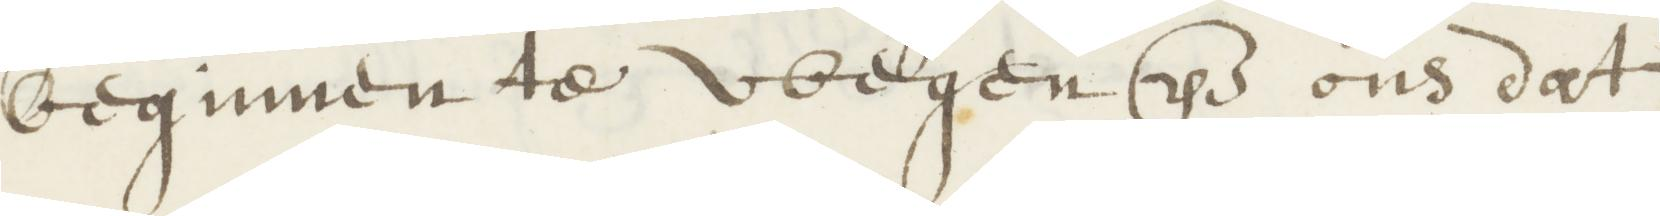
beginnen te wegen ende ons dat
